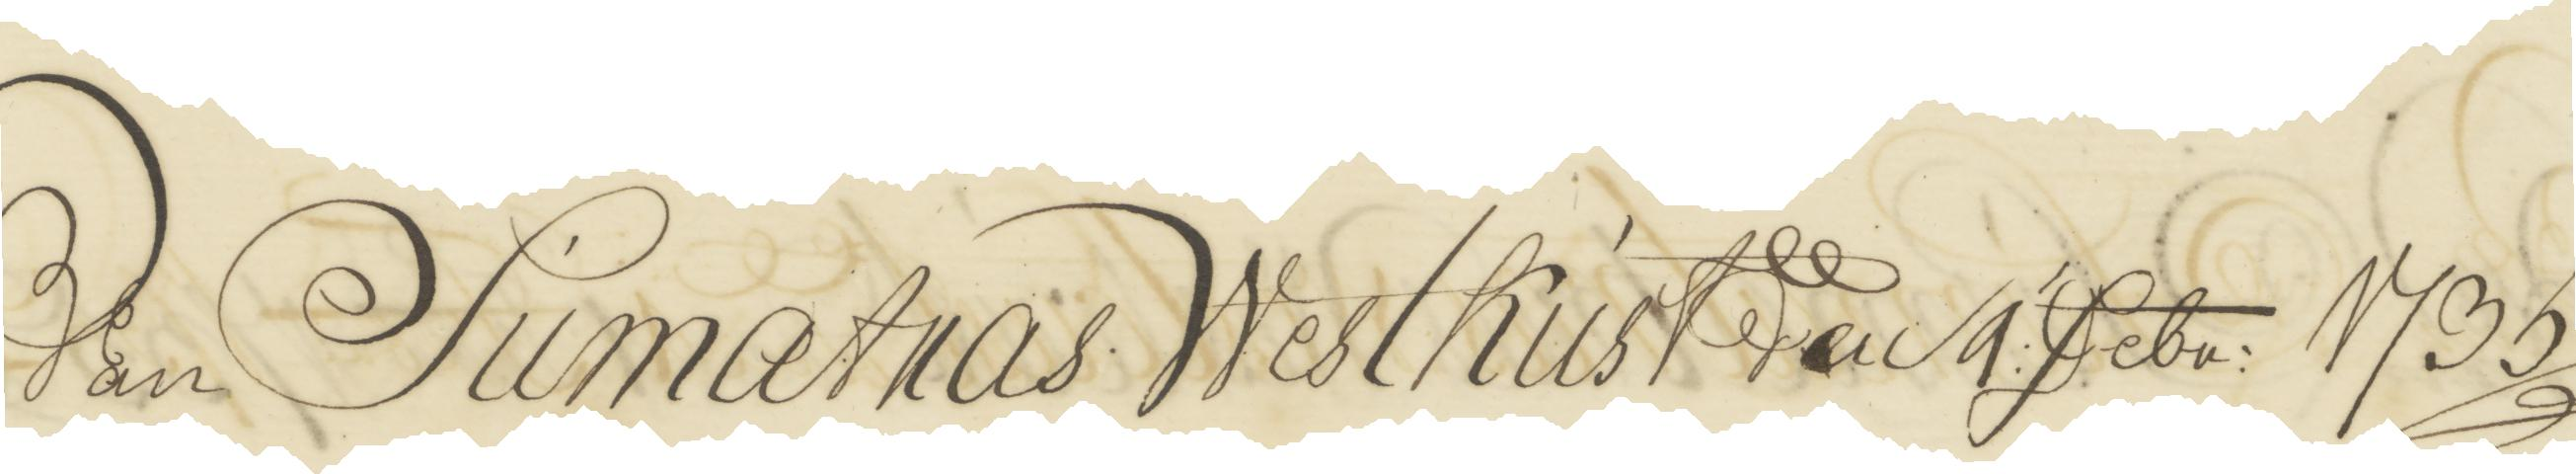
Van Sumatras Westkust den 4: Febr: 1735
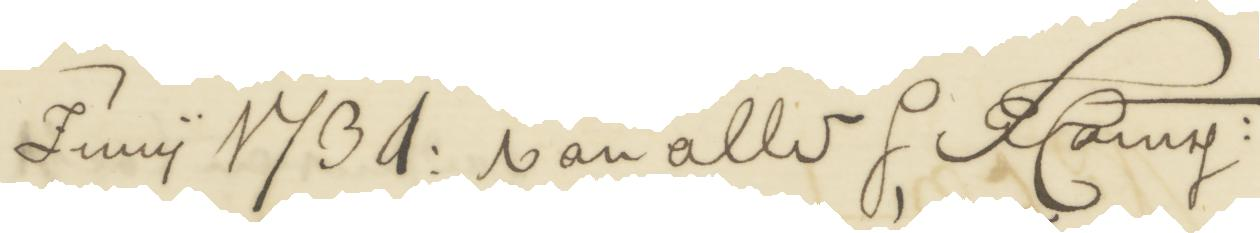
Iunij 1734: van alle 'sE:Comp:s
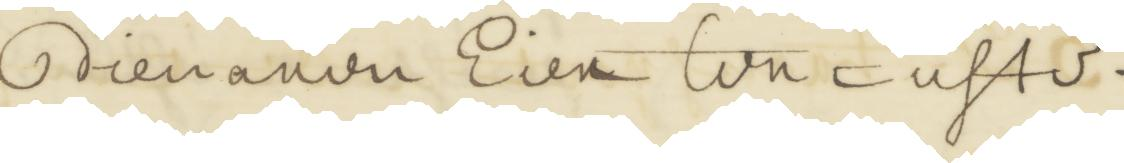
dienaren hier ten custe—
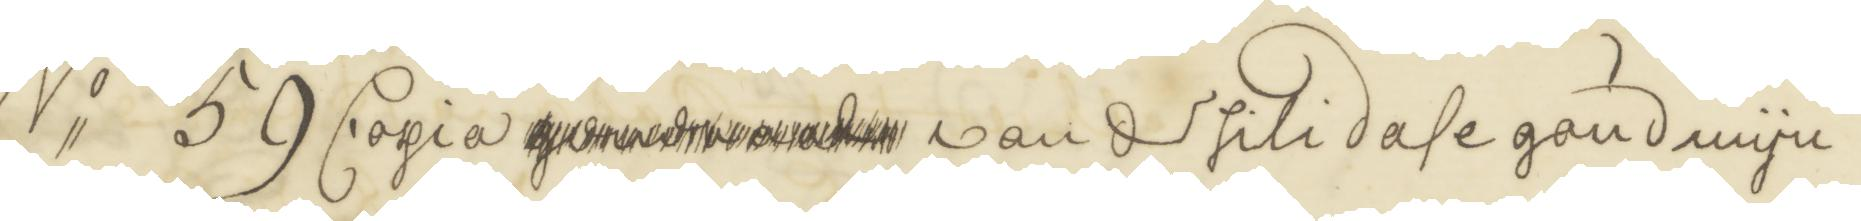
N„o 59 Copia generaal van de silidase goud mijn
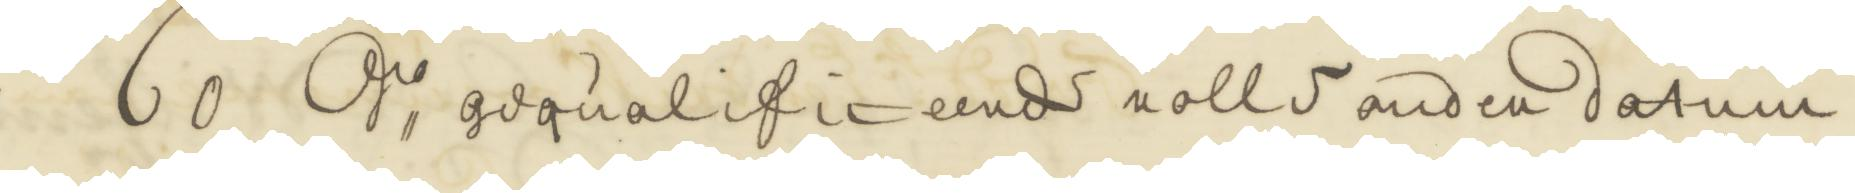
60 d„o gequalificeerde rolle onder datum
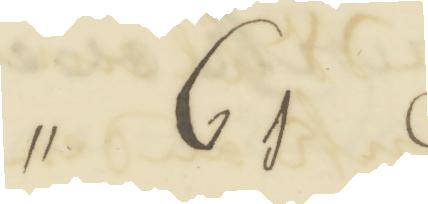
„ 61
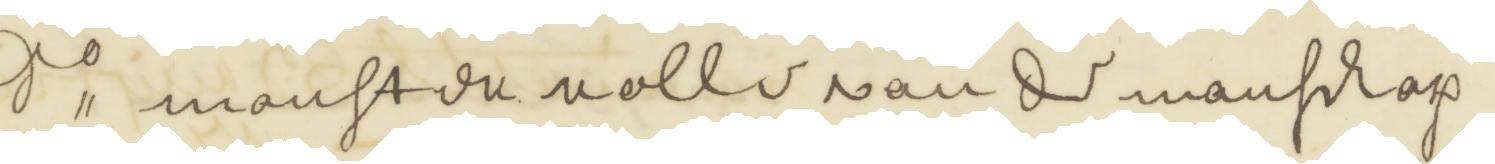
d„o monster rolle van de manschap
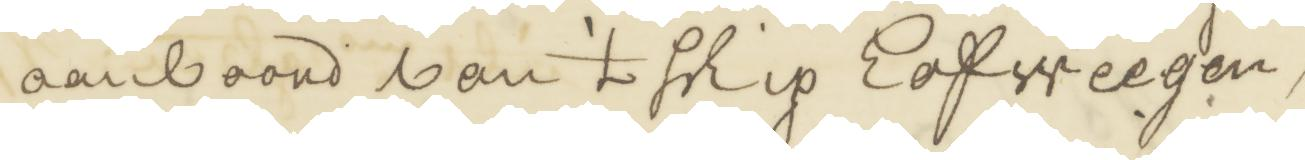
aanboord van ’t schip hofweegen,
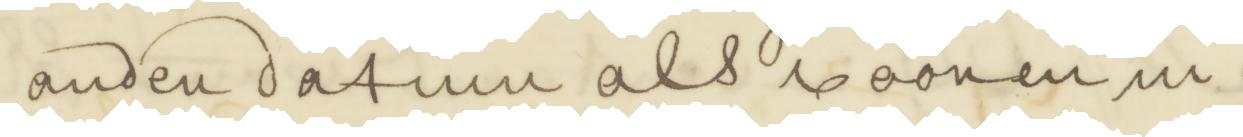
onder datum als vooren in
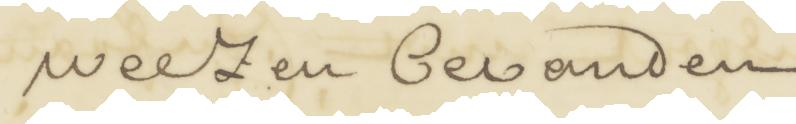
weezen bevonden;
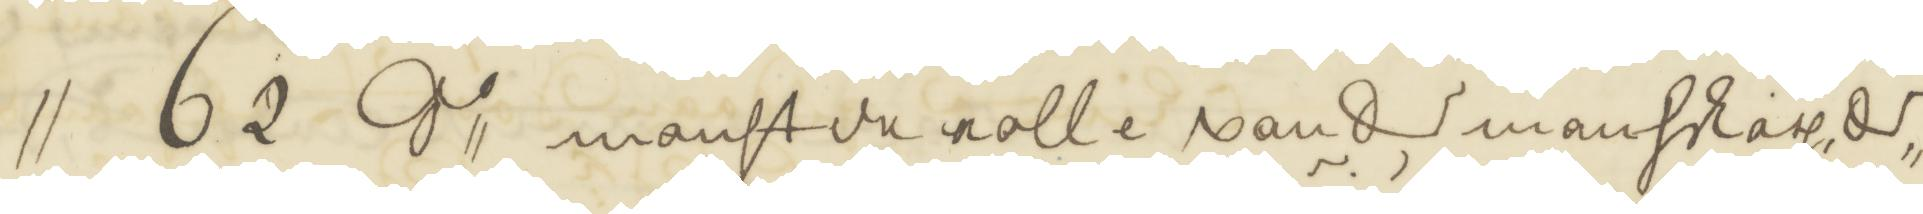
„ 62 d„o monster rolle van de manschap, de„
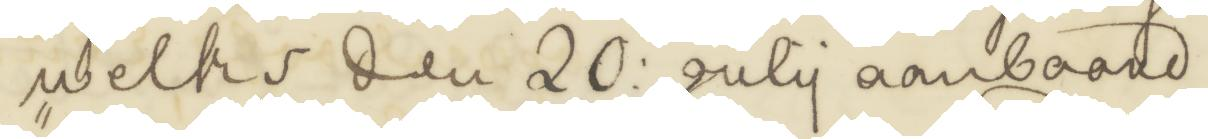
„welke den 20:' julij aanboord
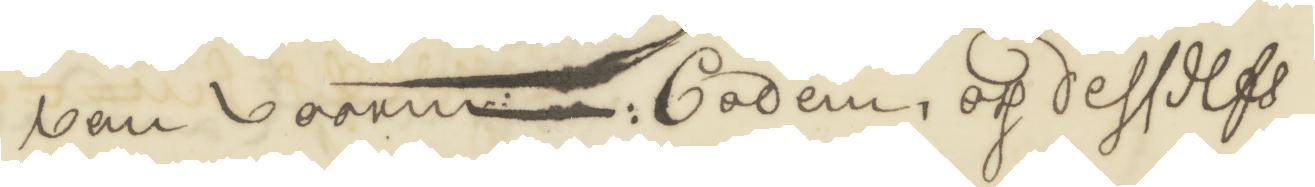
van voorm: bodem, op desselfs
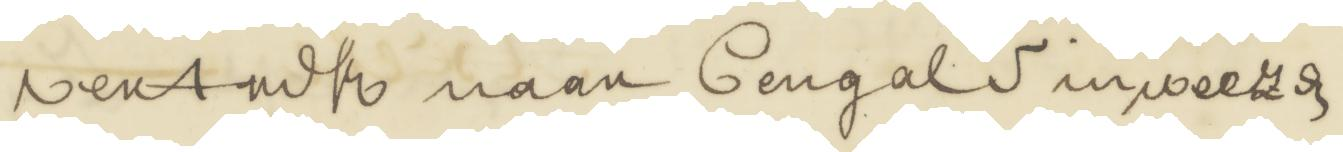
vertrek naar bengale in weezen
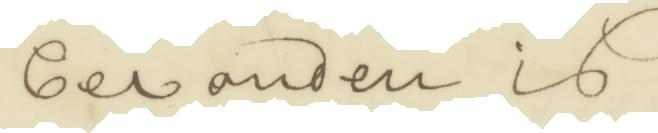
bevonden is —;
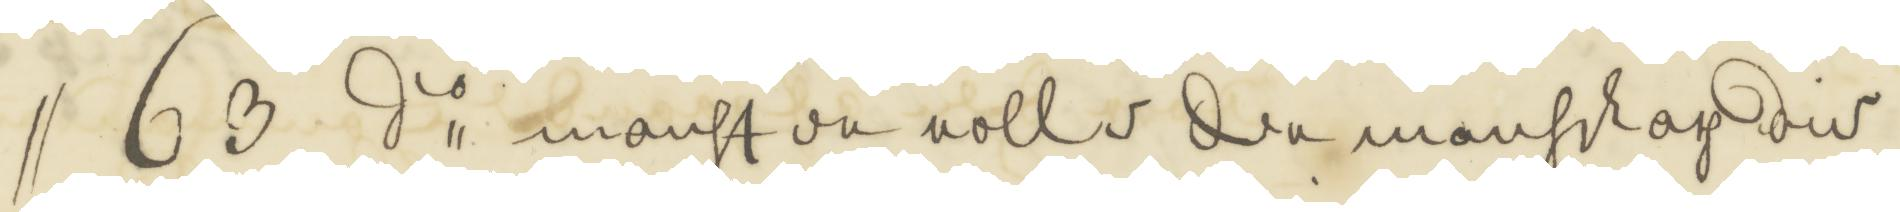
„ 63 d„o monster rolle der manschap die
